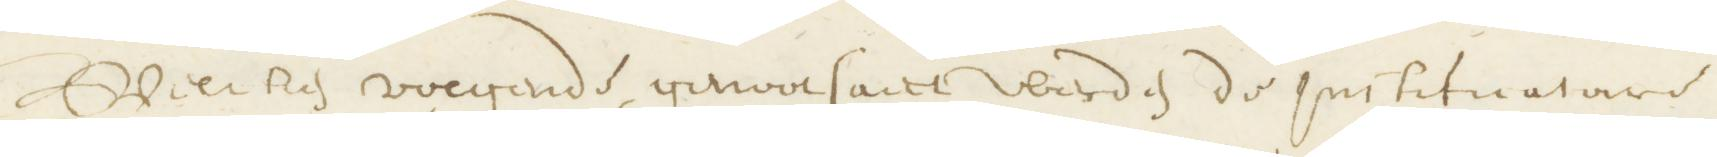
Welcken voegende genootsaect werden de justificatoire
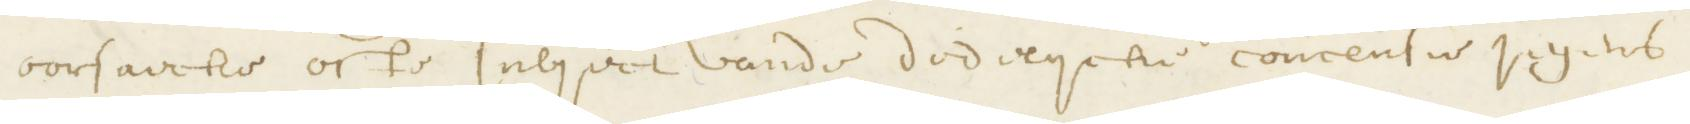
oorsaecke ofte subject vande dodelycke concentie jegens
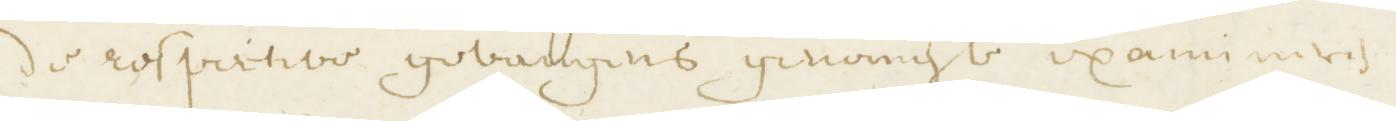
de respective gevangens genomen te examineren
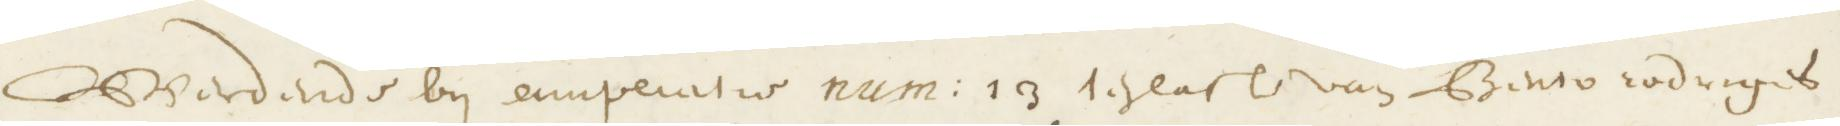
Werdende by ampliatie num: 13 ten laste van Berto redriges
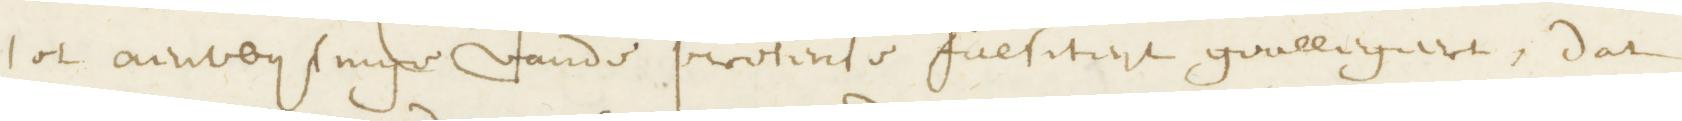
tot aenwijsinge vande pretense falsiteyt geellegeert, dat
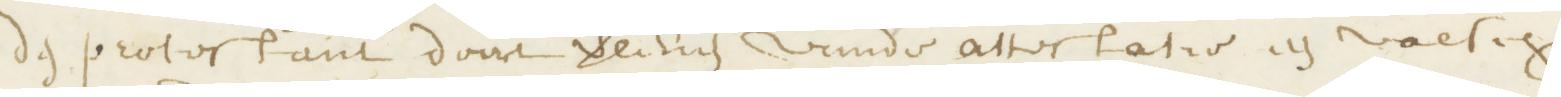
den protestant doort verlenen vande attestatie en valsche
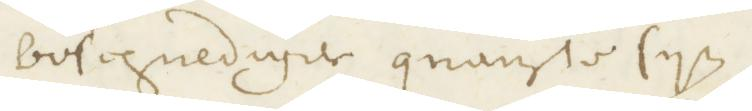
beschuldiger quam te syn
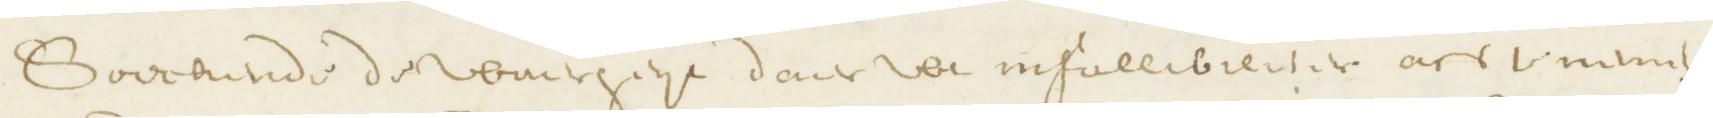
Soeckende de waerheyt daer wt infallibierter aff te nemen
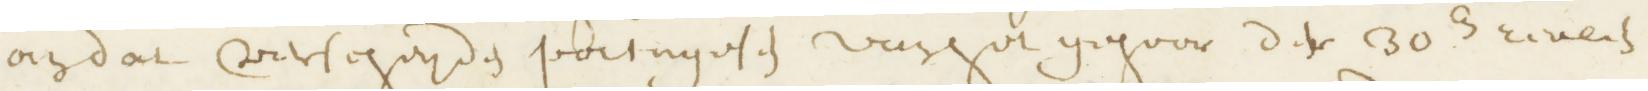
omdat verscheyden portugesen van het gehoor der 30.en revlen
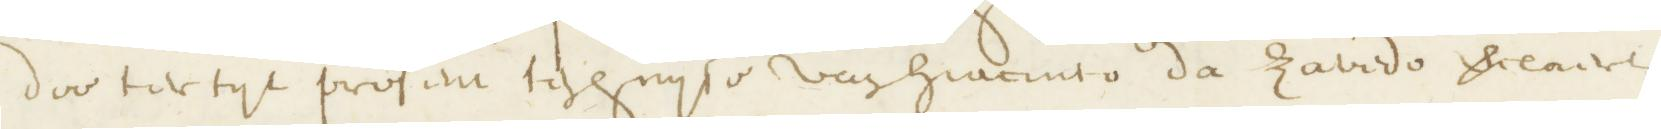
doe ter tyt present ten huyse van hiacinto da zavedo verclaert
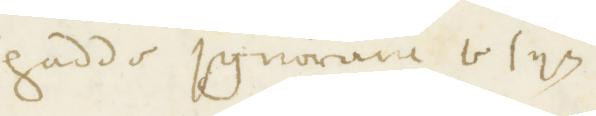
hadde ignorant te syn
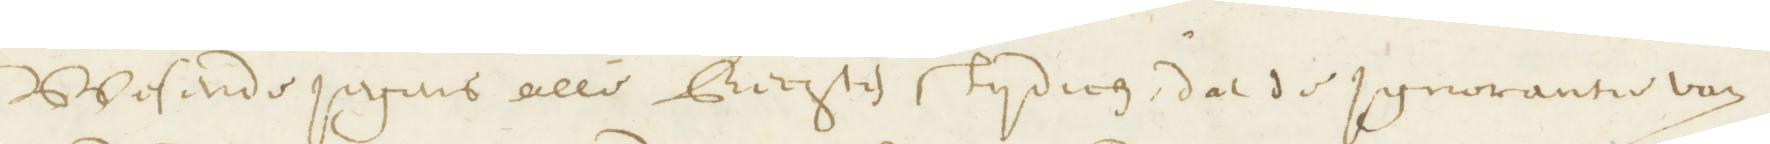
Wesende jegens alle Rechten stydich, dat de jgnoranten van
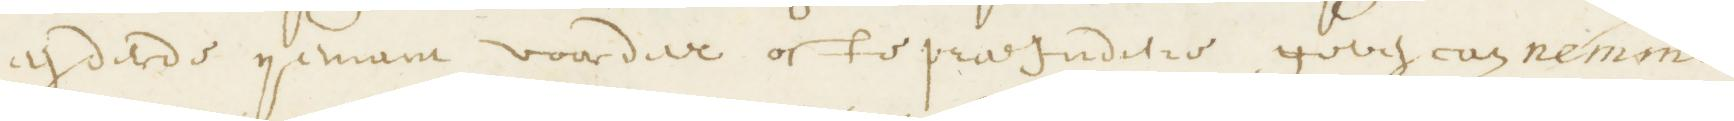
eyderde yemant voordeel offe praejnditie geven can nemmi
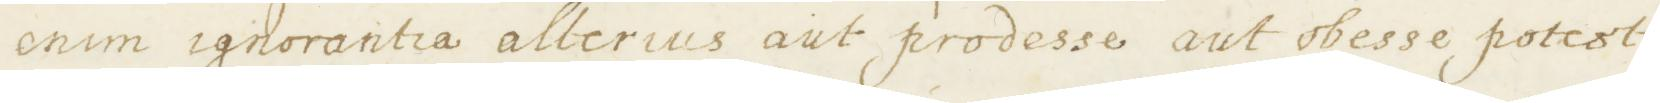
enum ignorantia alterius ant prodesse ant obesse protest
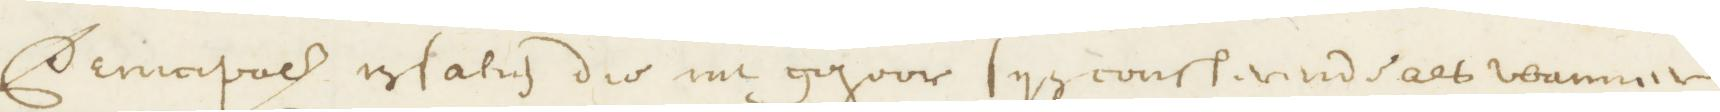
Principalijk in saken die int gehoor syn consterende als wanneer
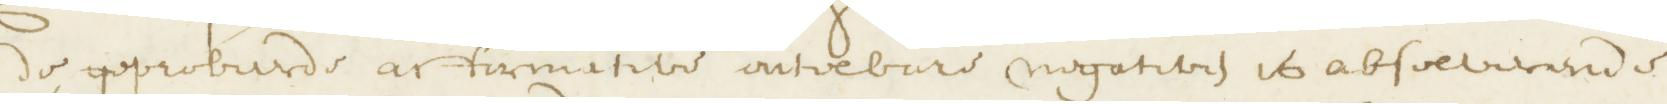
de geprobeerde affirmative ontelbare negativen is absolverende
